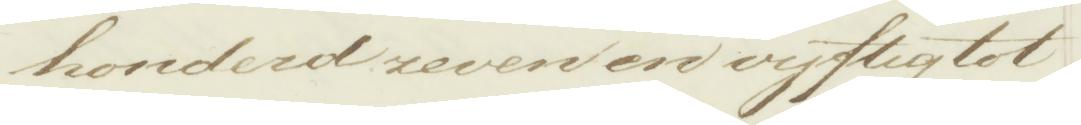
honderd zeven en vijftig tot
